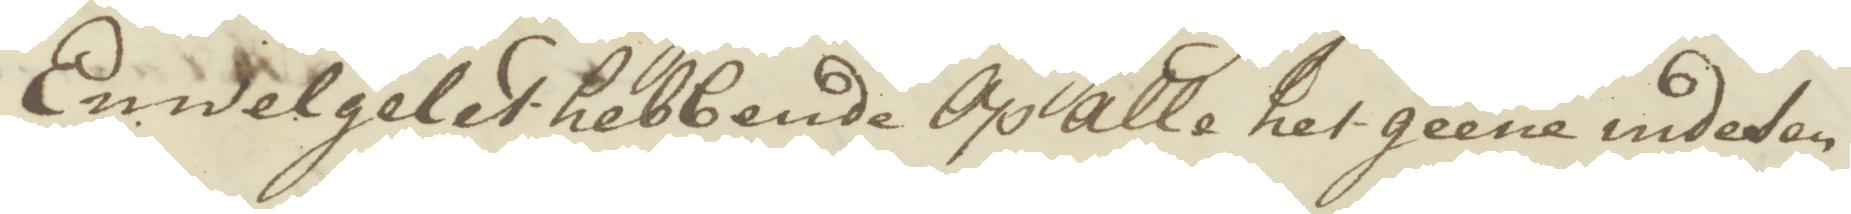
En welgelet hebbende op alle het geene indesen
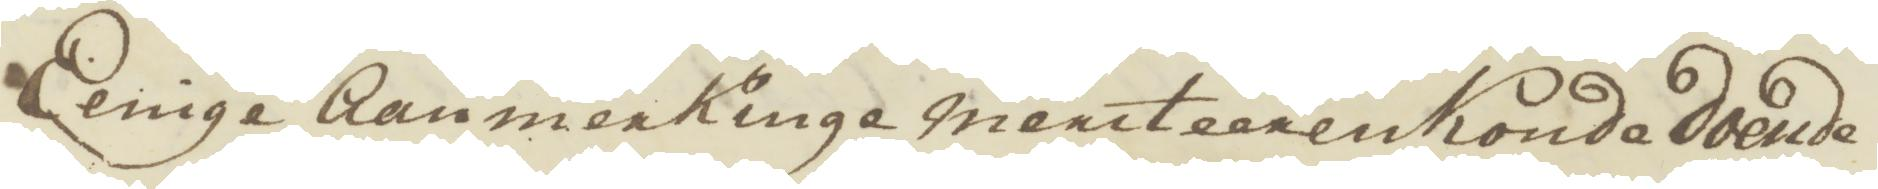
Eenige aanmerkinge meriteeren konde doende
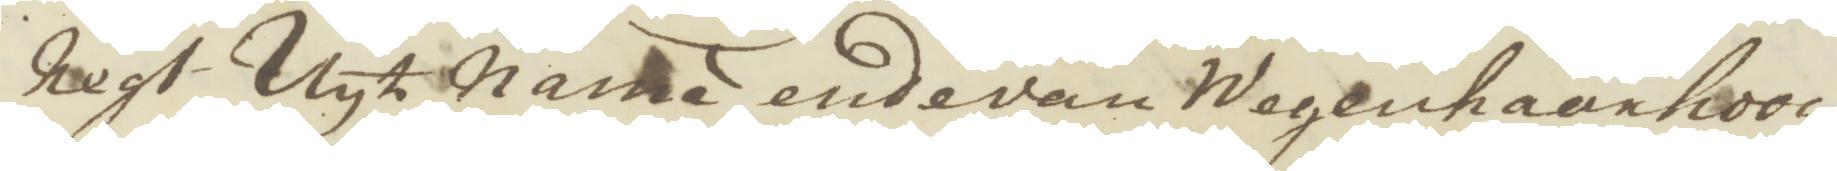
regt Uyt name ende van wegen haar hoog
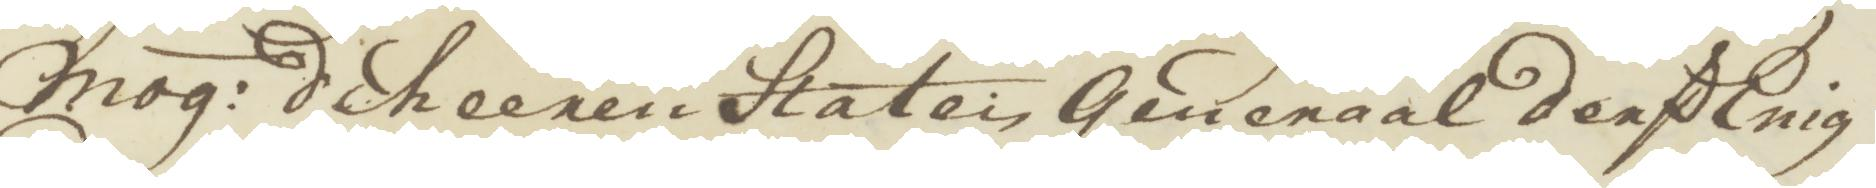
mog: de heeren staten generaal der verEnig
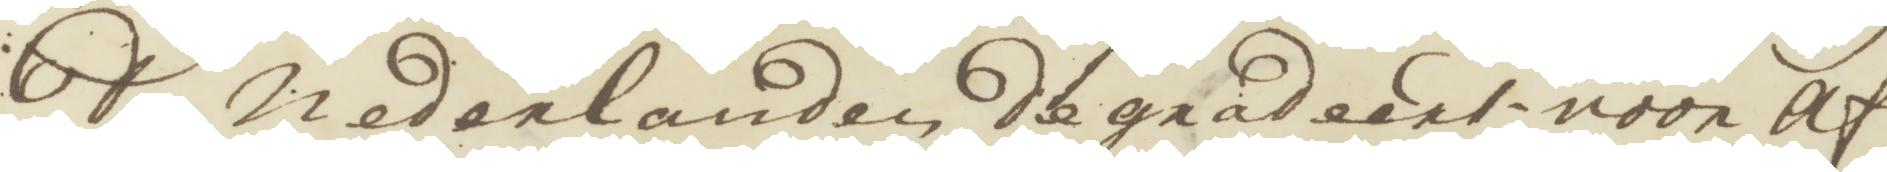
de nederlanden degradeert voor af
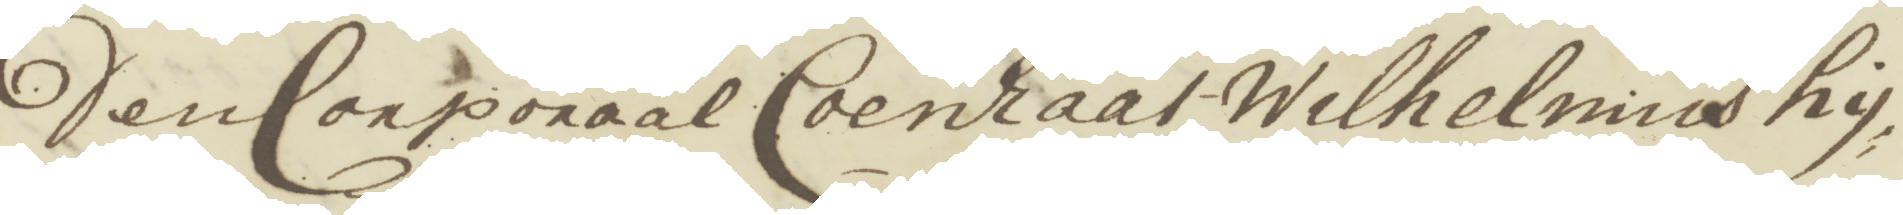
den Corporaal Coenraat Wilhelmus hij„
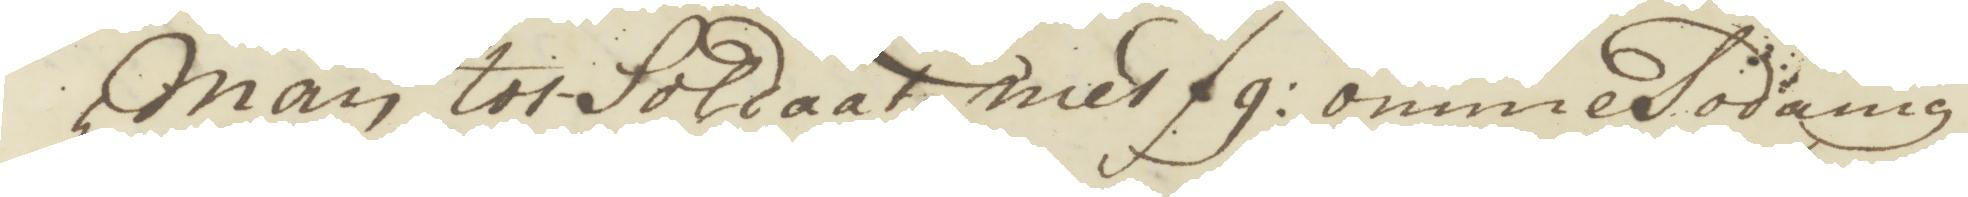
„man tot soldaat met ƒ 9: omme sodanig
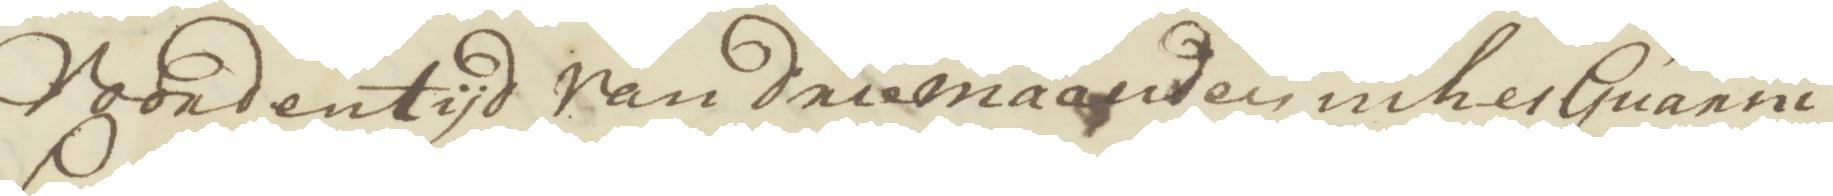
voor den tijd van drie maanden in het Guarni
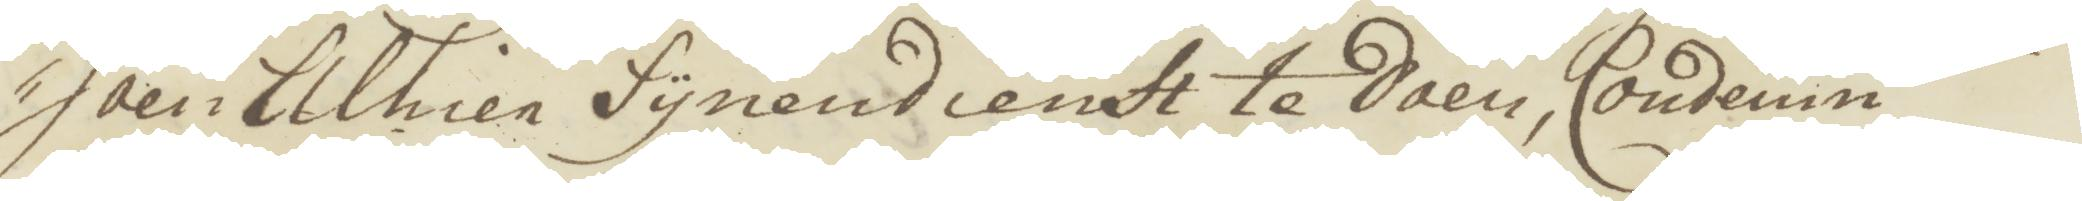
„soen alhier sijnen dienst te doen, Condemn=t
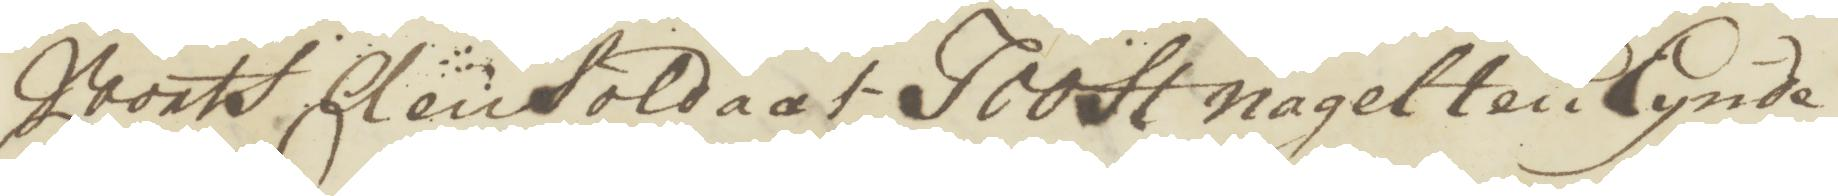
voorts aen soldaat Ioost nagel ten Eynde
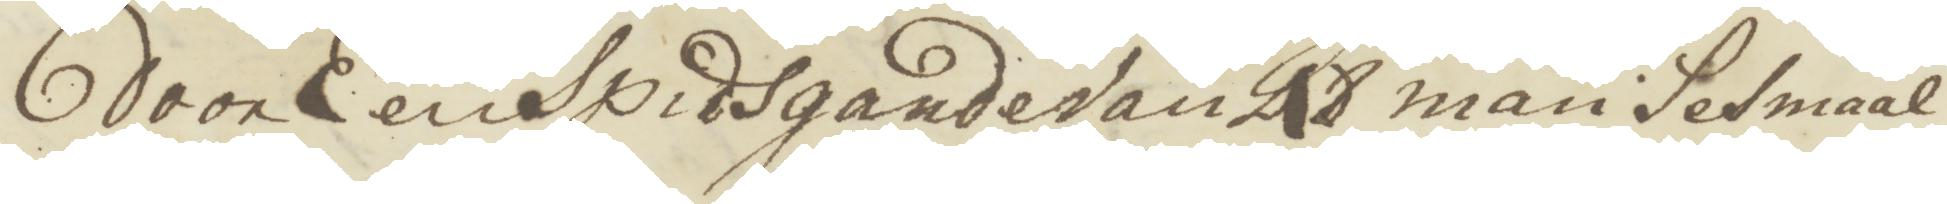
door Een spidsgarde van 48 man sesmaal
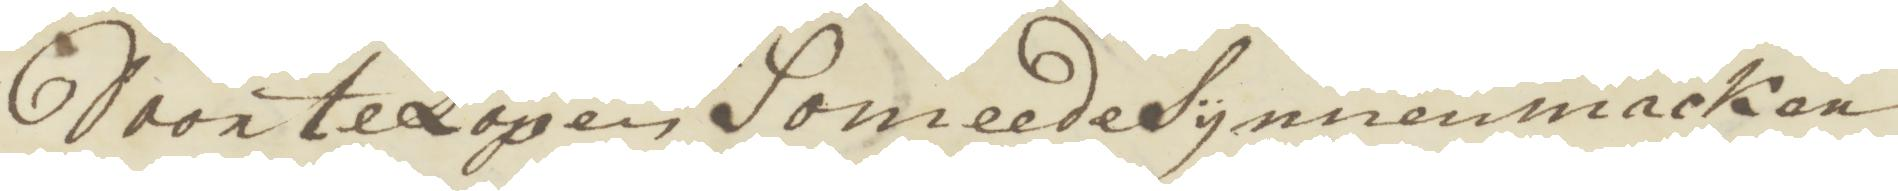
door te Lopen someede sijnnen macker
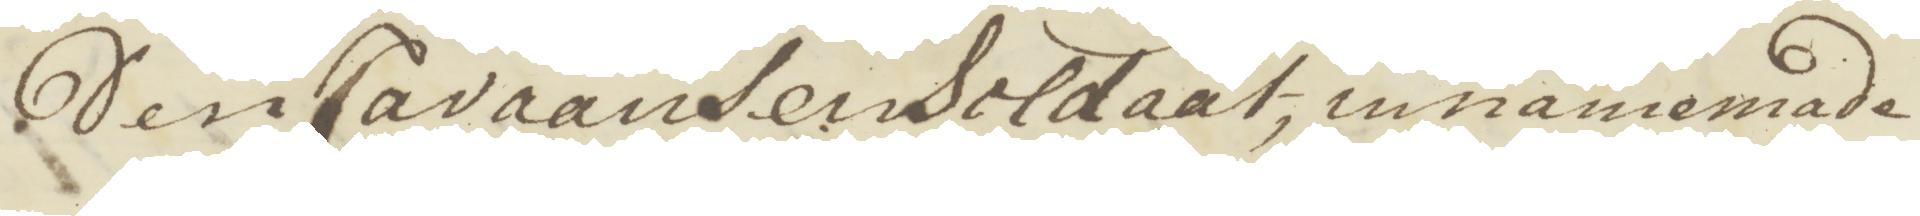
den Javaans en soldaat, in name made
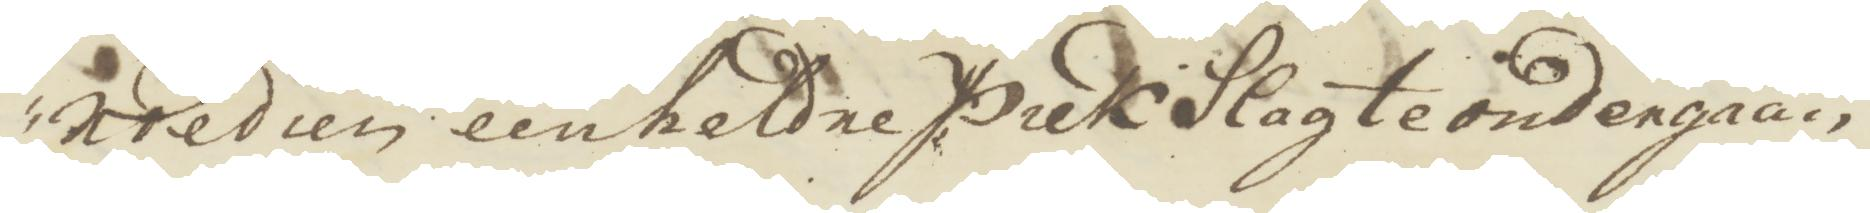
„roedien een heldre piek slag te ondergaan
